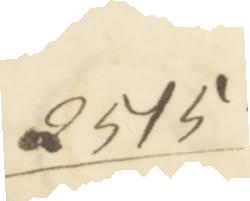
2515
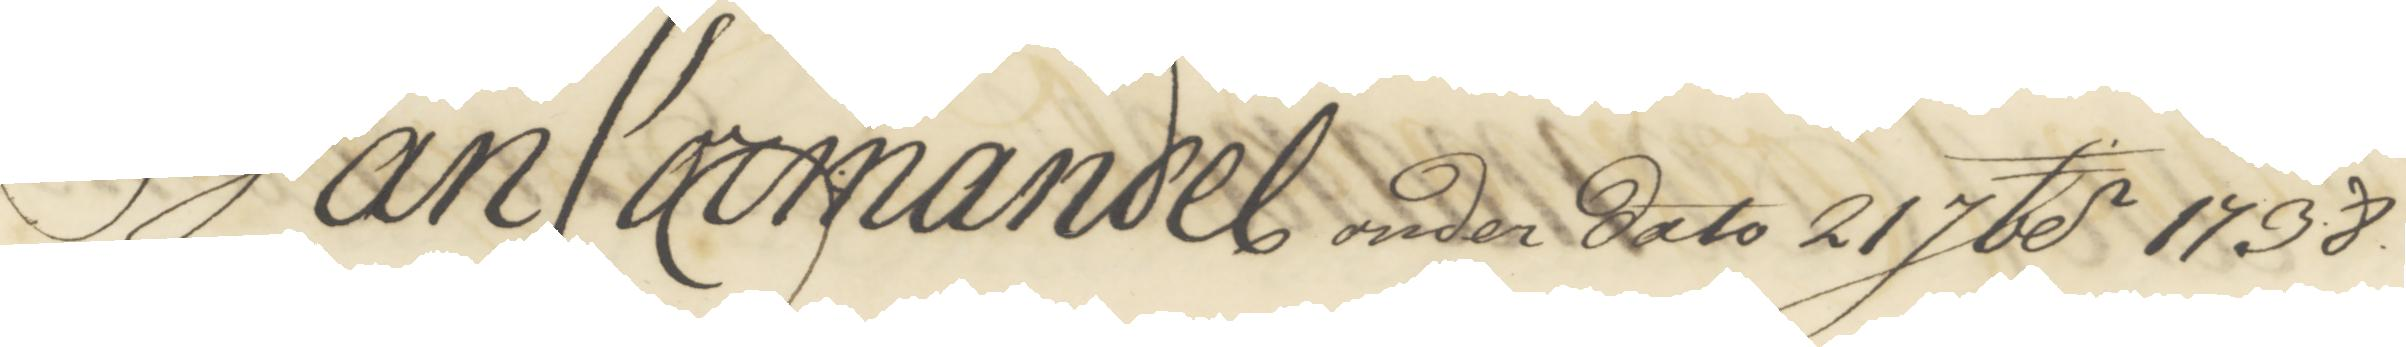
Van Cormandel onder dato 21 jber 1738.
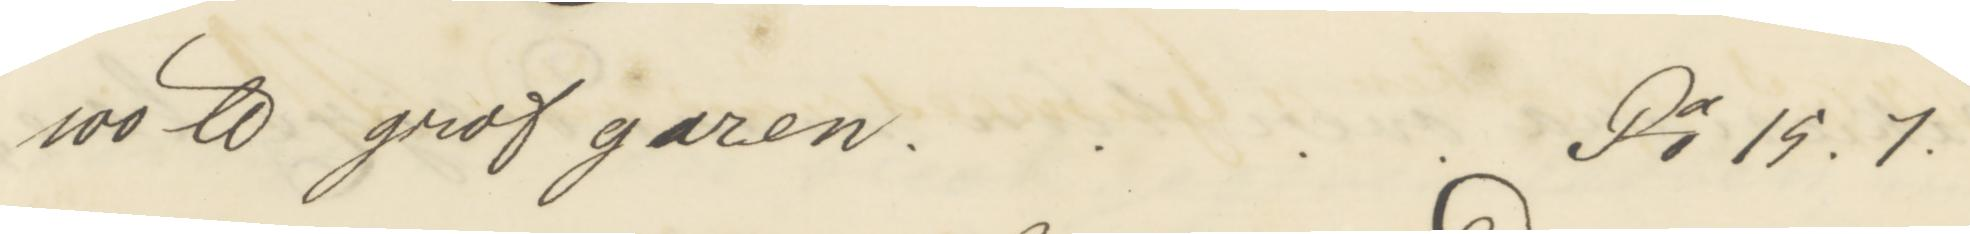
100 lb grof garen . . . . P„r 15. 7.
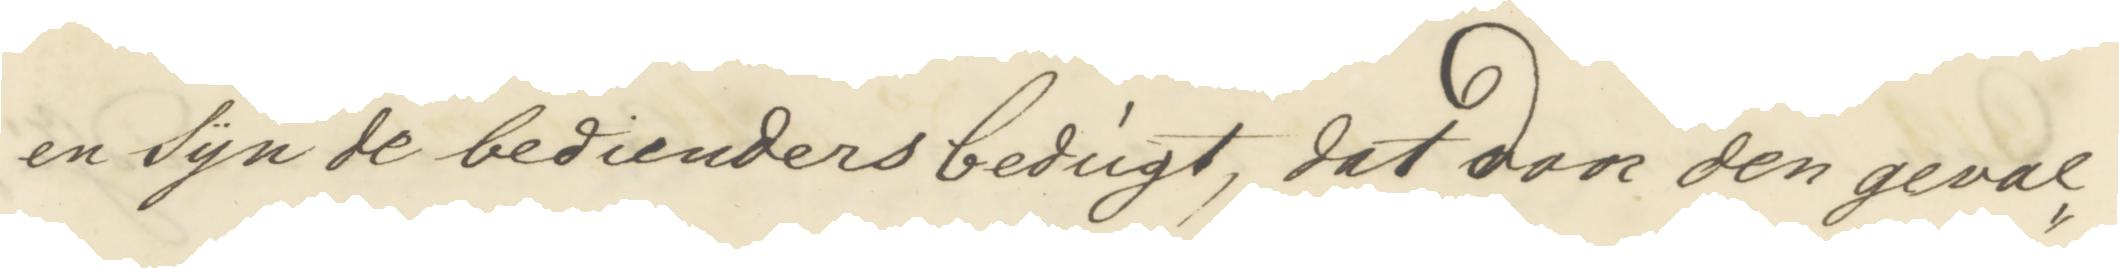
en sijn de bedienders bedugt, dat door den geval„
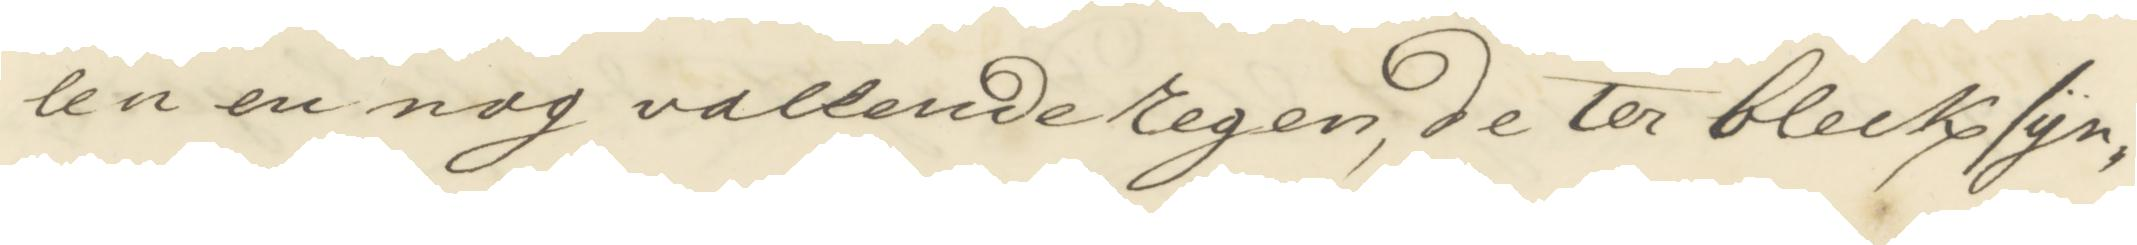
len en nog vallende regen, de ter bleek sijn„
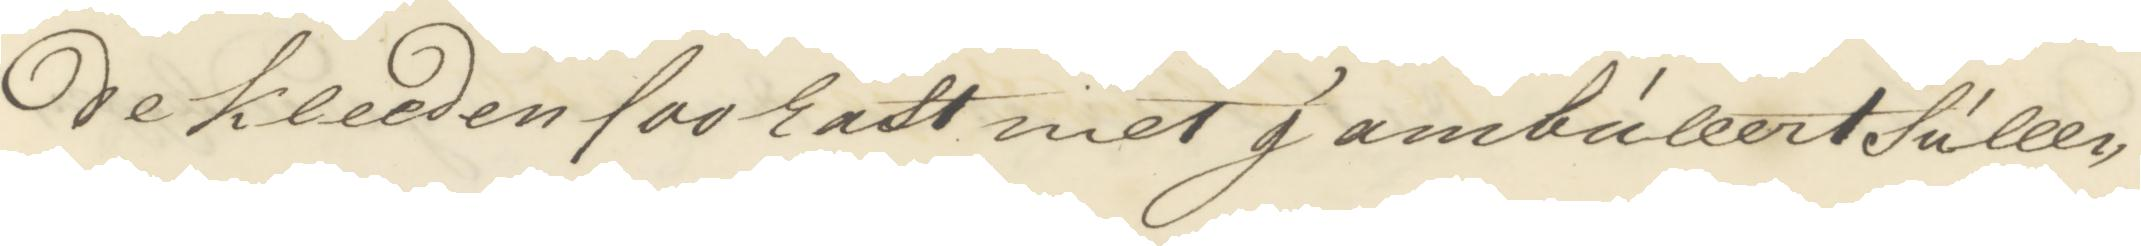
de kleeden soo hast niet g'ambuleert sullen
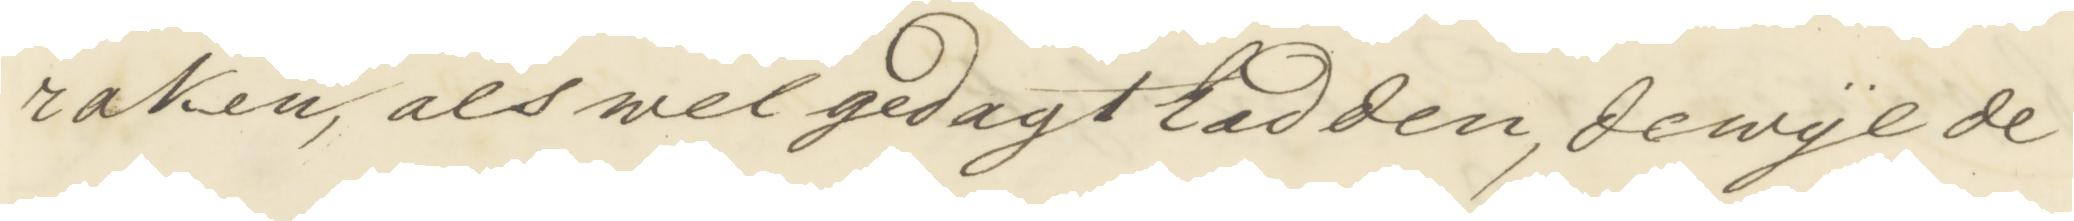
raken, als wel gedagt hadden, dewijl de
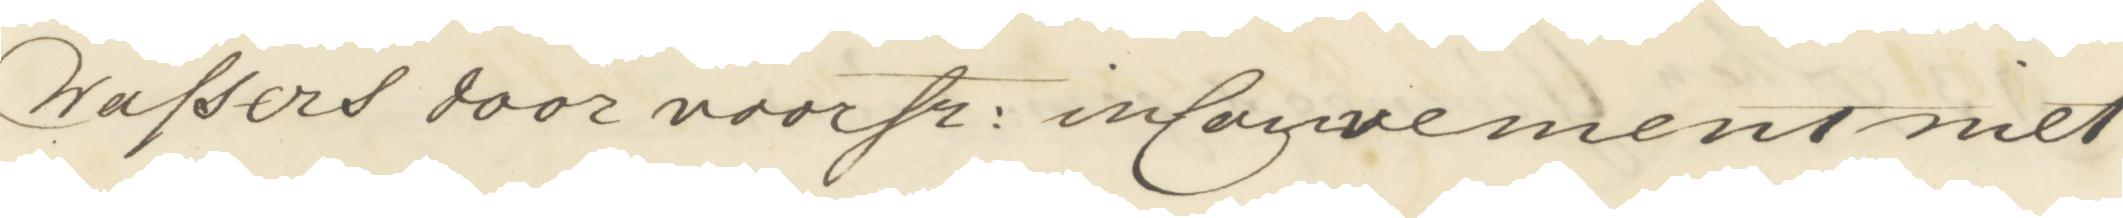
wassers door voorsz: inconvement niet
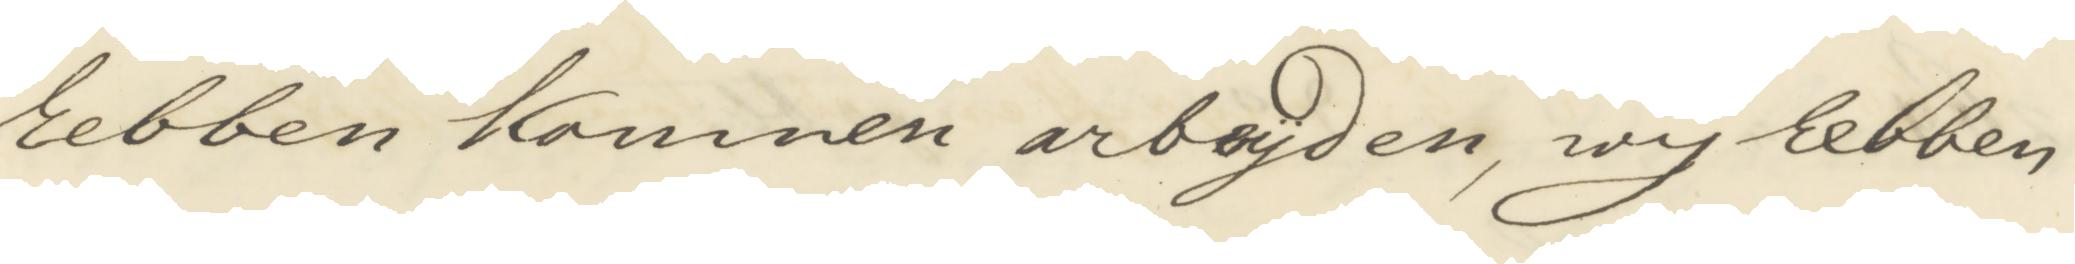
hebben konnen arbeijden, wij hebben
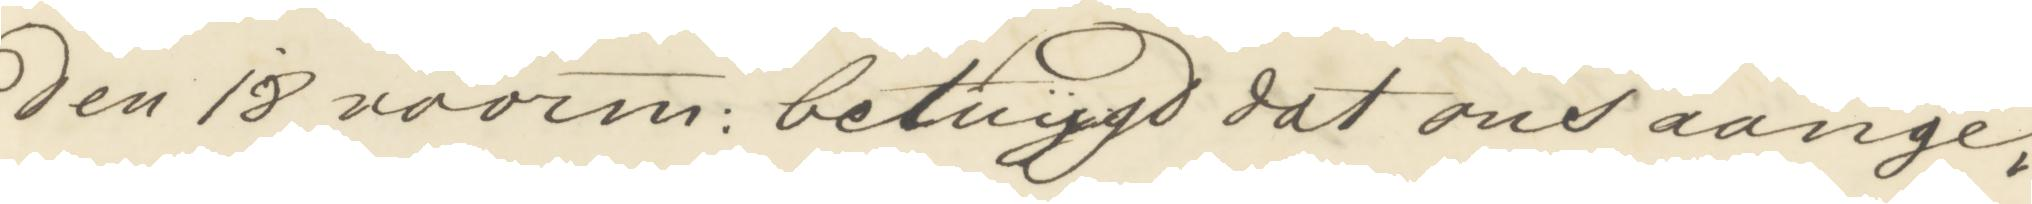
den 18 voorm: betuijgd dat ons aange
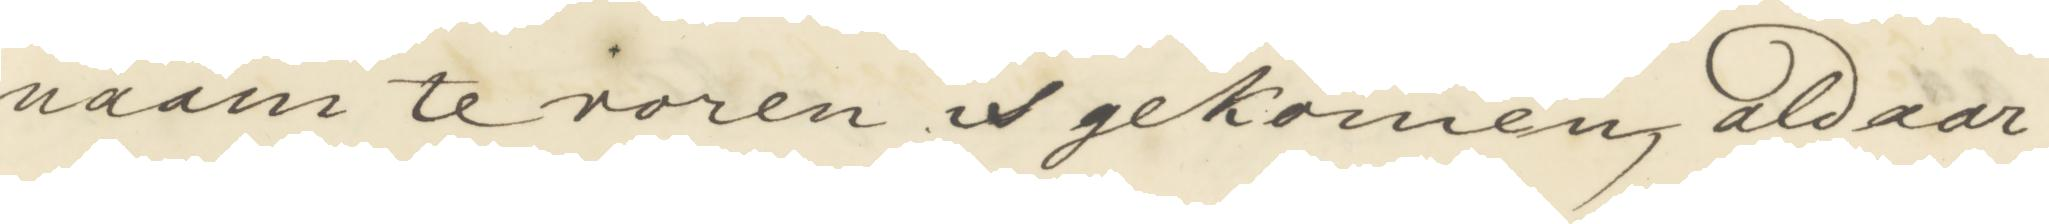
naam te voren is gekomen, aldaar
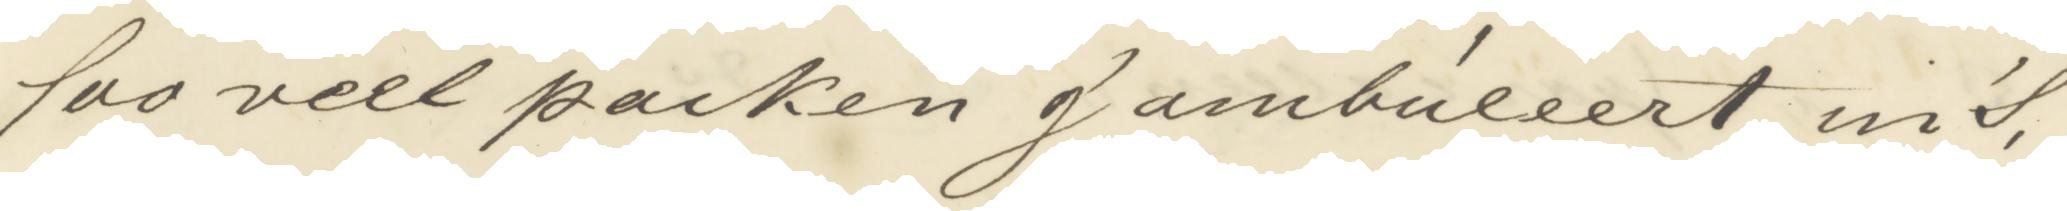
soo veel packen g’ambuleert, in 's,
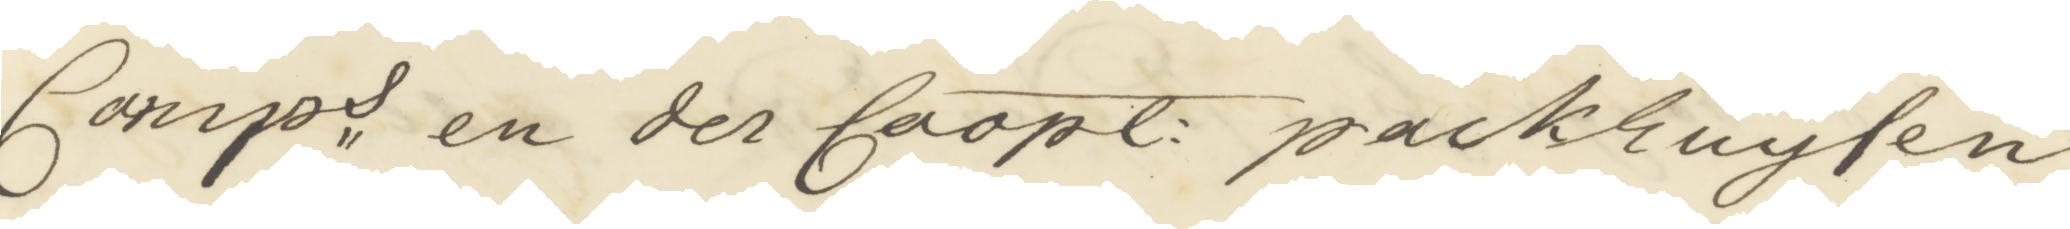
Comp„s en der Coopl: packhuijsen,
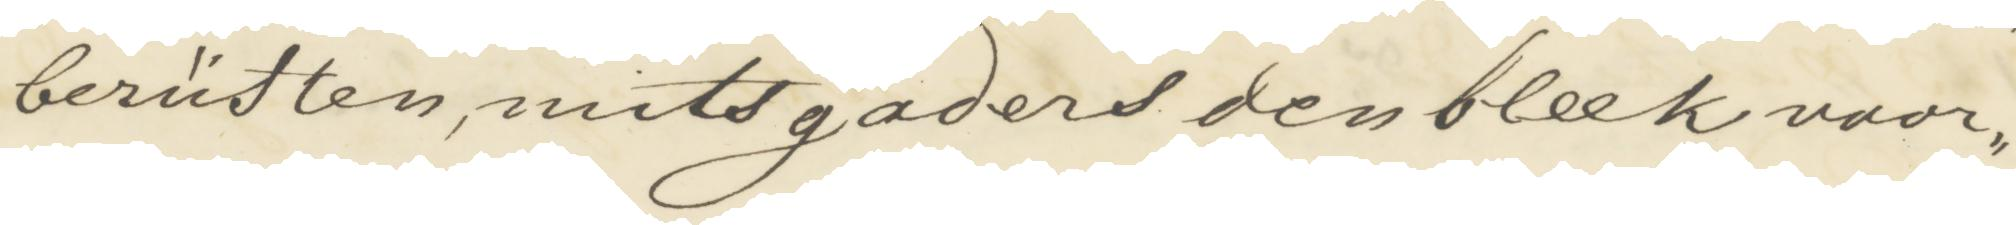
berusten, mitsgaders den bleek voor„
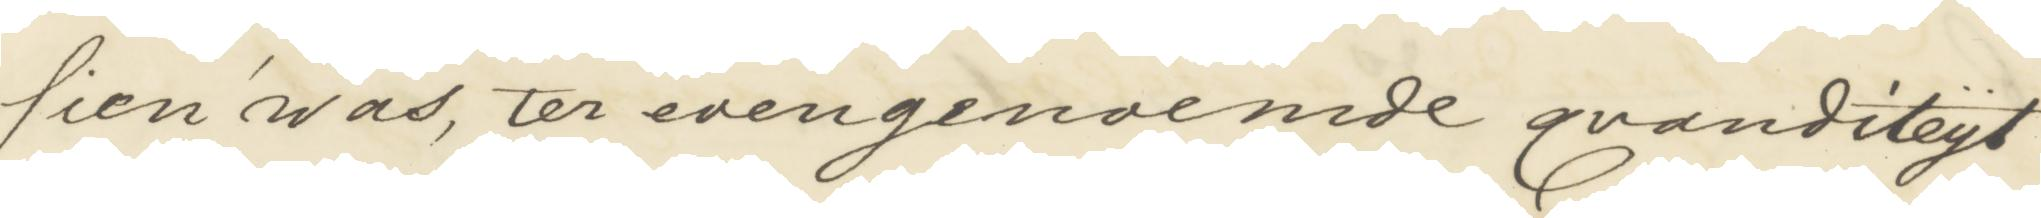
sien was, ter evengenoemde quanditeijt
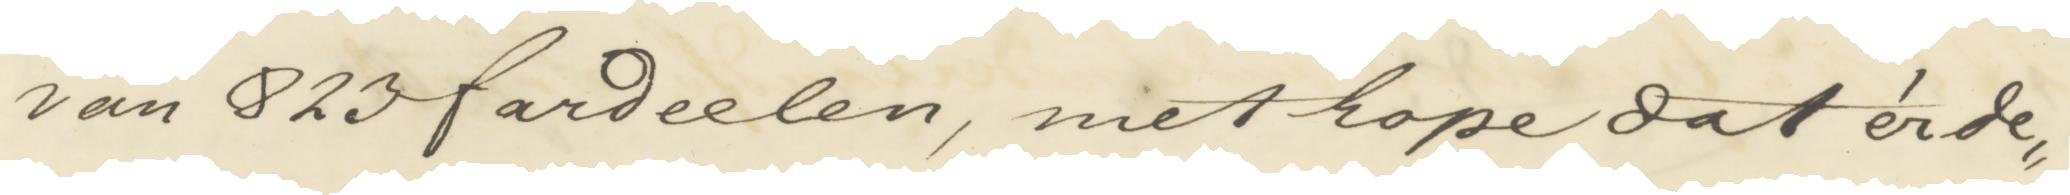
van 823 fardeelen, met hope dat 'er de„
